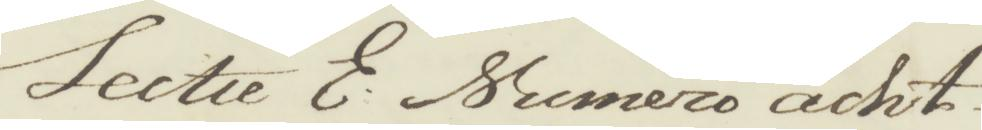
Sectie E: Numero acht.
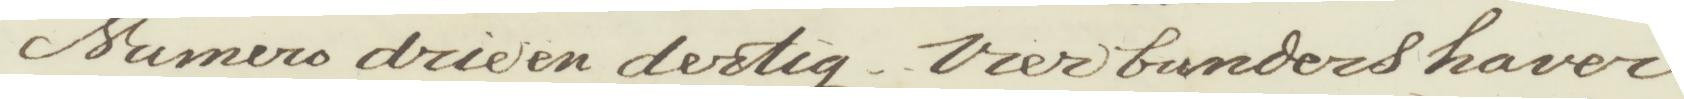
Numero drie en dertig -- vier bunders haver
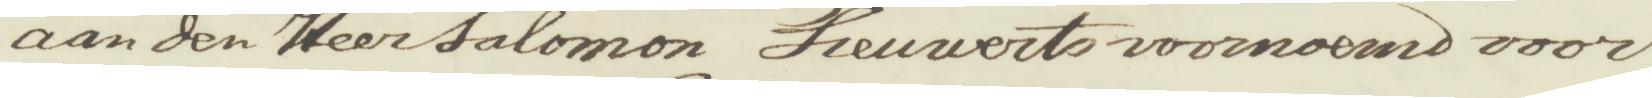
aan den Heer Salomon Sieuwerts voornoemd voor
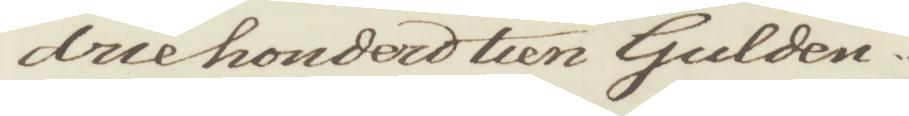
drie honderd tien Gulden.
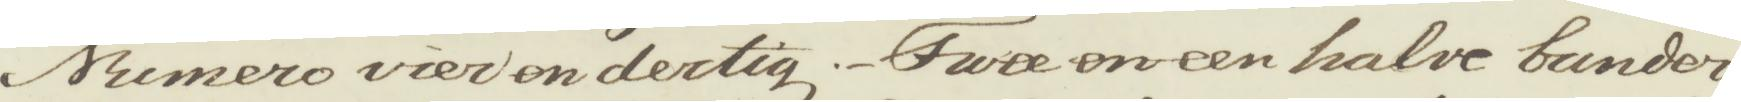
Numero vier en dertig. - Twee en een halve bunder
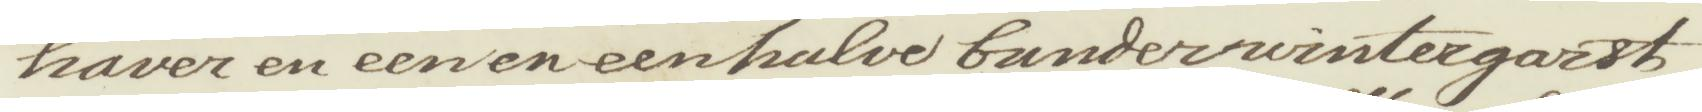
haver en een en een halve bunder wintergarst
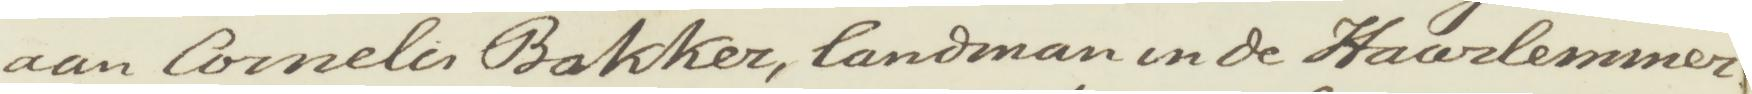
aan Cornelis Bakker, landman in de Haarlemmer
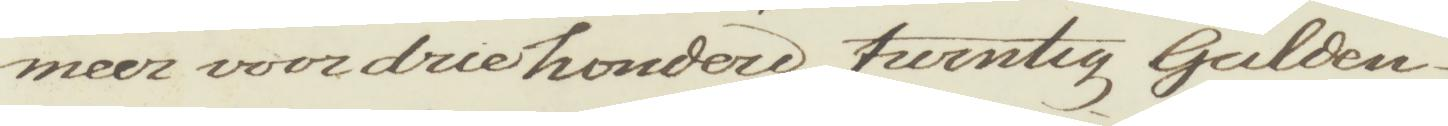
meer voor drie honderd twintig Gulden
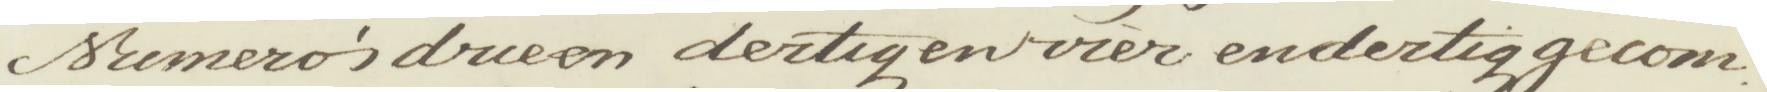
Numero's drie en dertig en vier en dertig gecom„
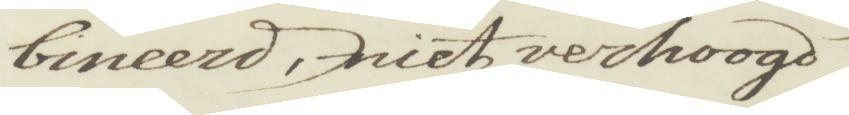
bineerd, niet verhoogd
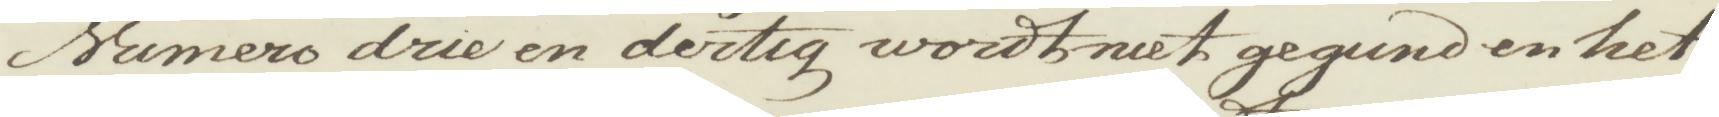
Numero drie en dertig wordt niet gegund en het
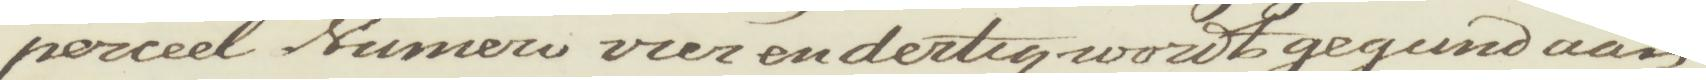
perceel Numero vier en dertig wordt gegund aan
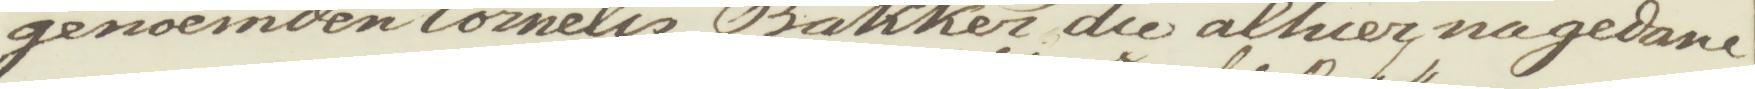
genoemden Cornelis Bakker, die alhier na gedane
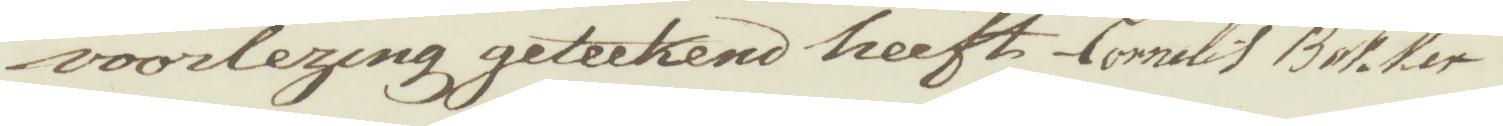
voorlezing geteekend heeft Cornelis Bakker
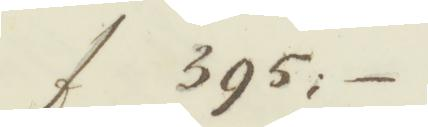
ƒ 395; —
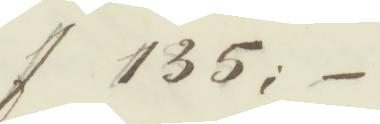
ƒ 135; —
